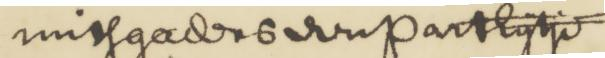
mitsgaders een parthijtje
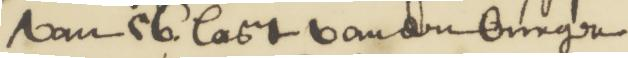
van 56. last van den burger
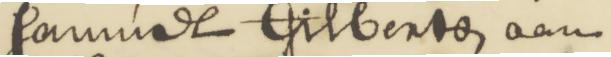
Samuel Gilberto aan
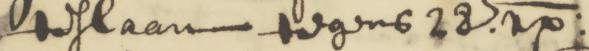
teslaan tegens 28.' rx:
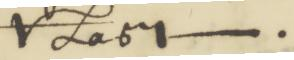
t Last.
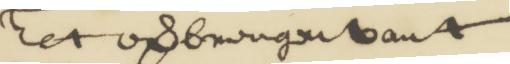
het overbrengen van't
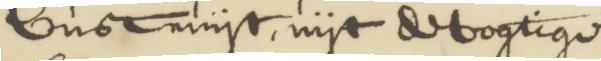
buscruijt, uijt de vogtige
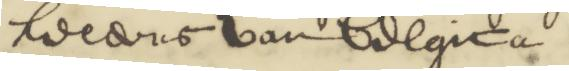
kelders van belgica
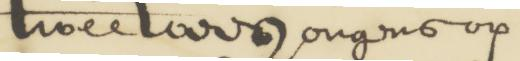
twee weesjongens op
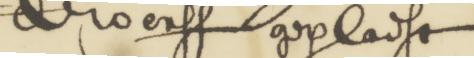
de werff geplaest
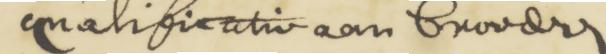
qualificatie aan broederen
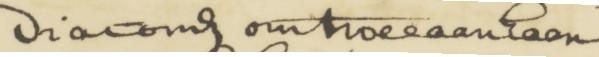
diaconen om twee aan haar
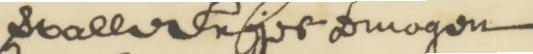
vervalle Erfjes temogen
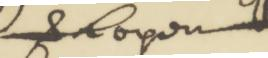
verkopen
